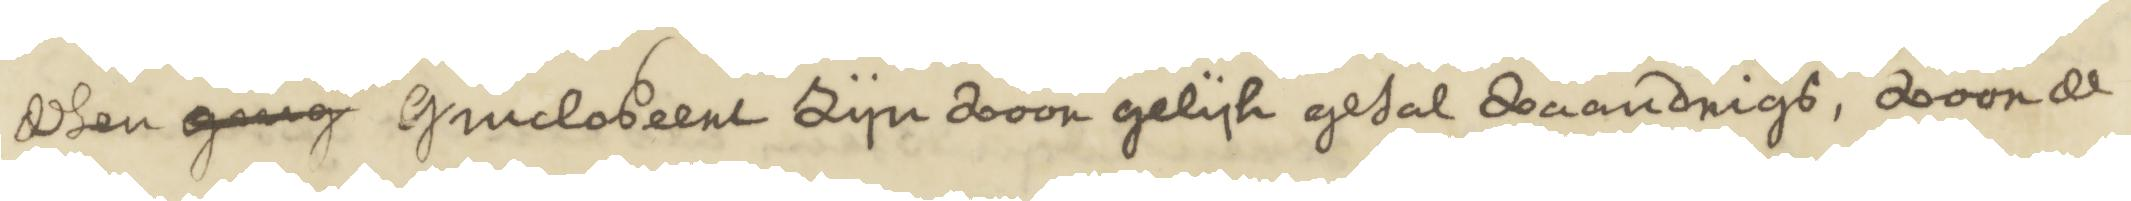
desen ging gincloseert zijn voor gelijk getal vaandrigs, voor de
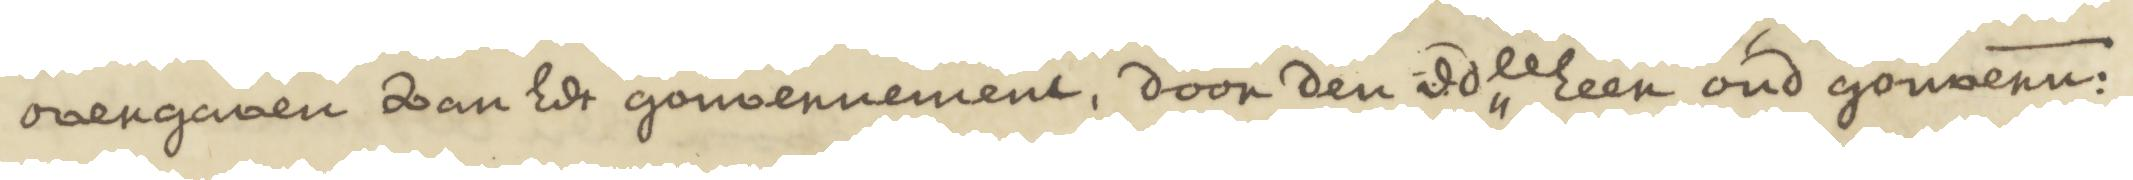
overgaven van het gouvernement, door den ed„le heer oud gouvern:
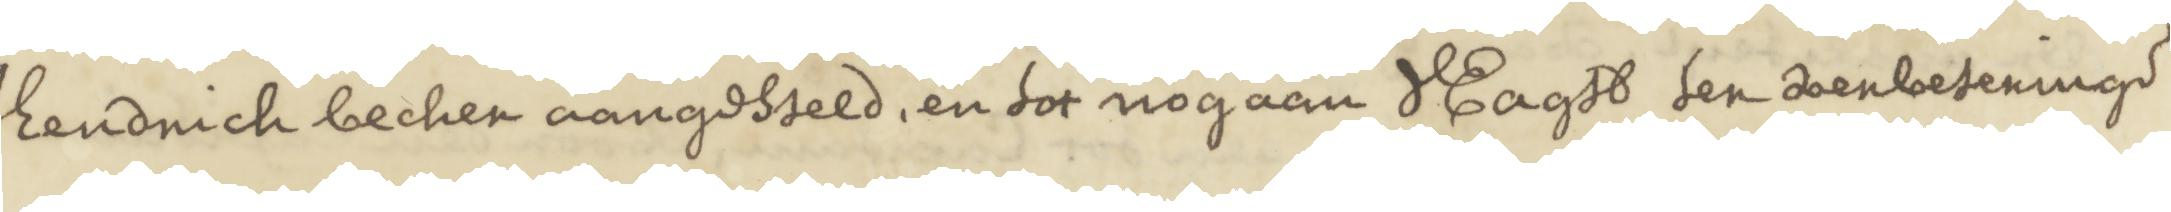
hendrick becker aangesteld, en tot nog aan VE agtb ter verbeteringe
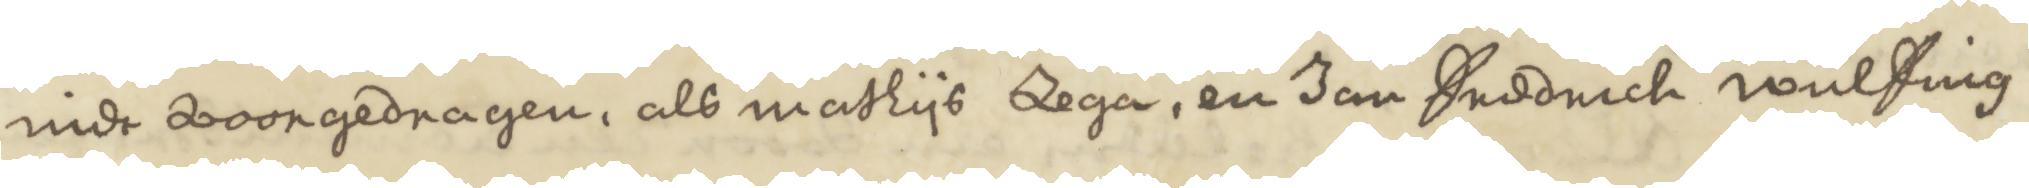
niet voorgedragen, als mathijs zega, en Ian fredrick wulfing
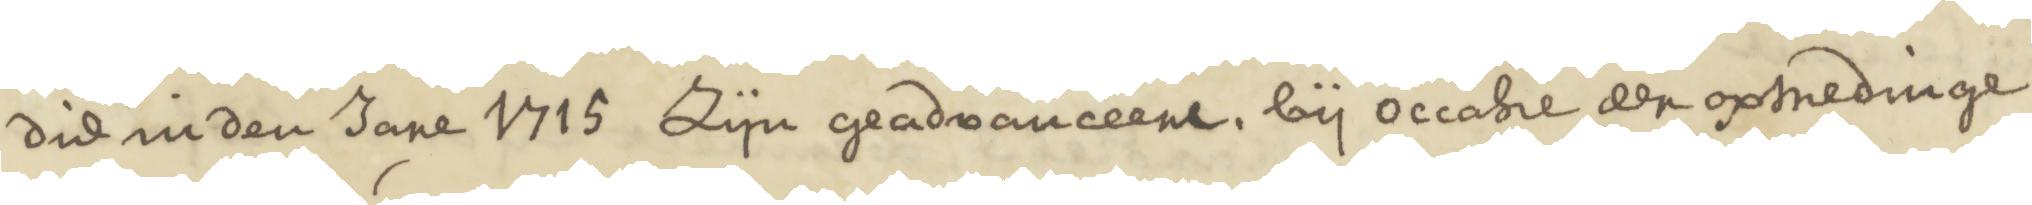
die in den Iare 1715 zijn geadvanceert, bij occasie der opsnedinge
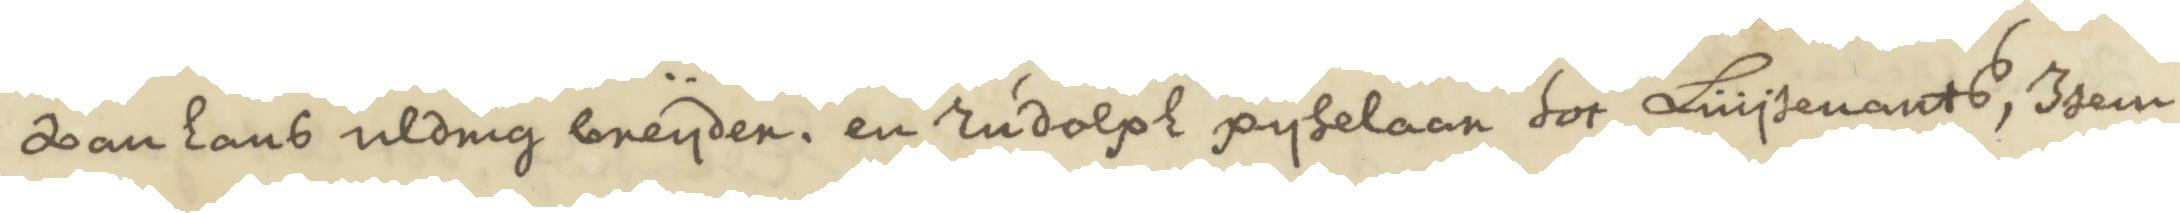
van hans uldrig breijder, en rudolph pijselaar tot Luijtenants, Item
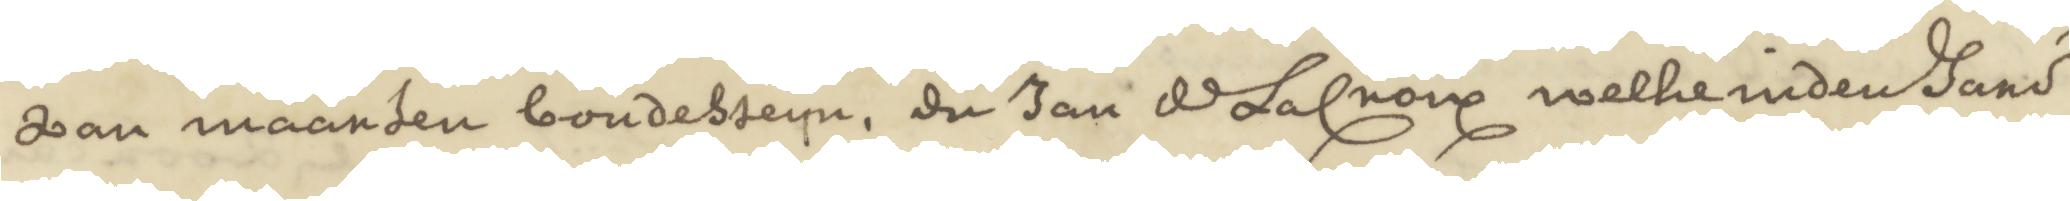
van maarten boudesteijn, en Ian de Lacroix welke inden Iare
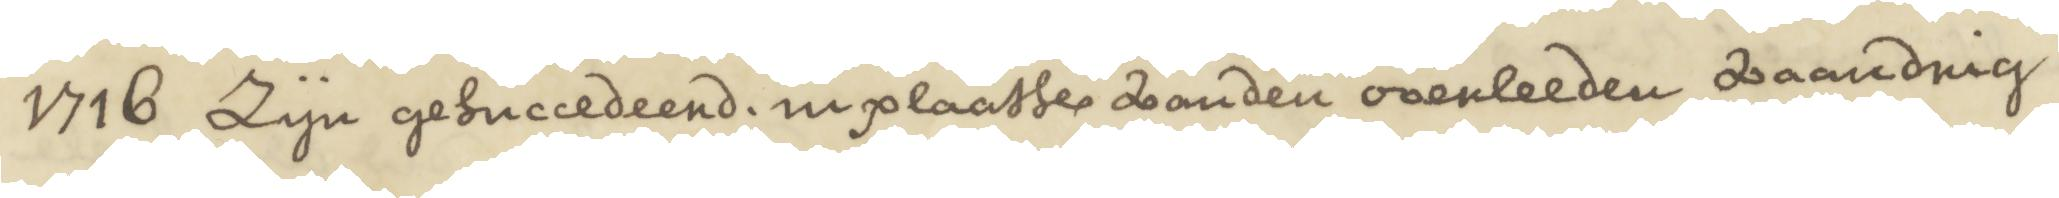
1716 zijn gesuccedeerd, in plaatse van den overleeden vaandrig
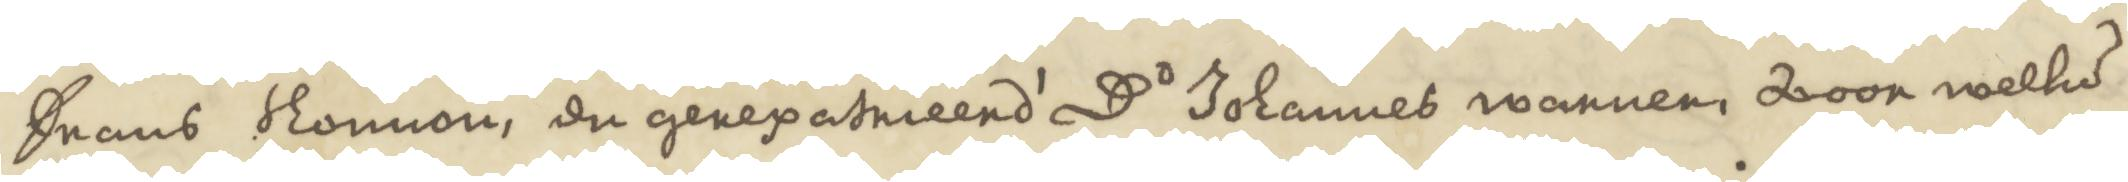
frans thonnon, en gerepatrieerd' Ed Iohannes warner, voor welke
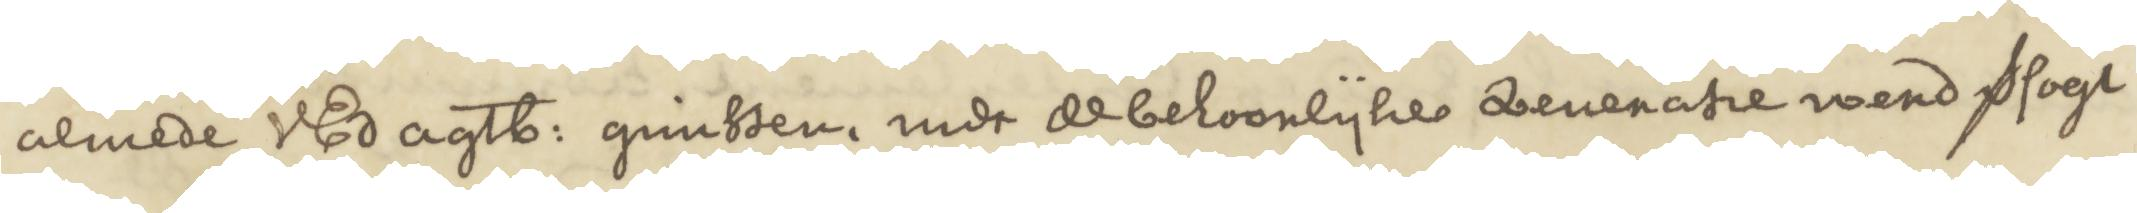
almede VEd agtb: gunsten, met de behoorlijke veneratie werd versogt
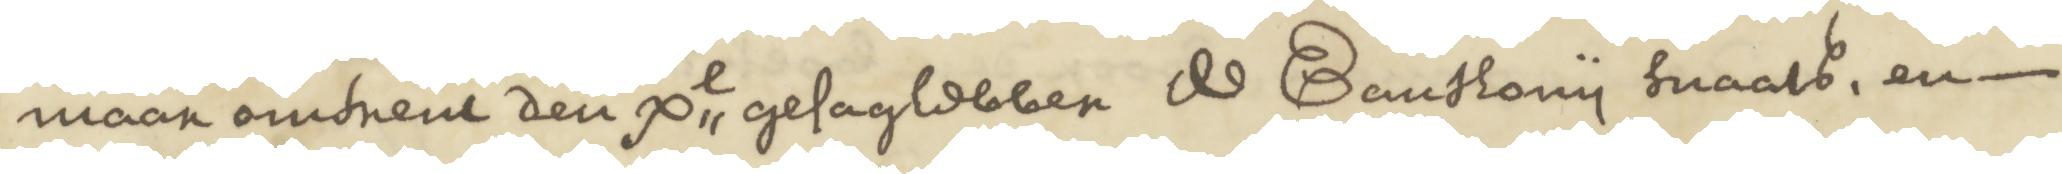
maar omtrent den p„l gesaghebber de E anthonij snaats, en —
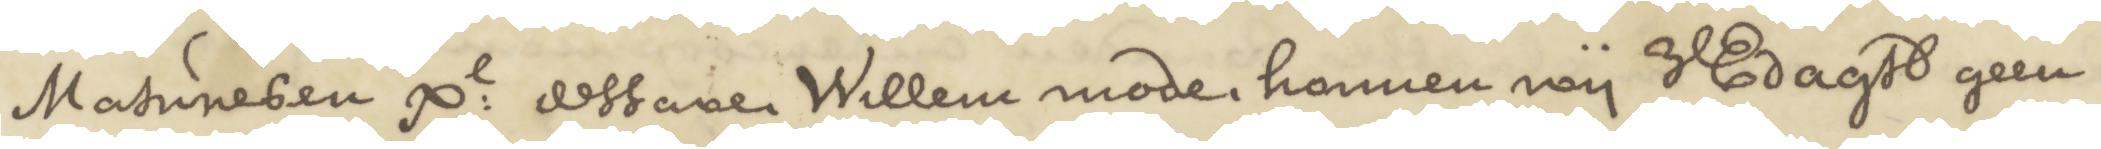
Maturesen p:l dessave Willem mode, konnen wij VEd agtb geen
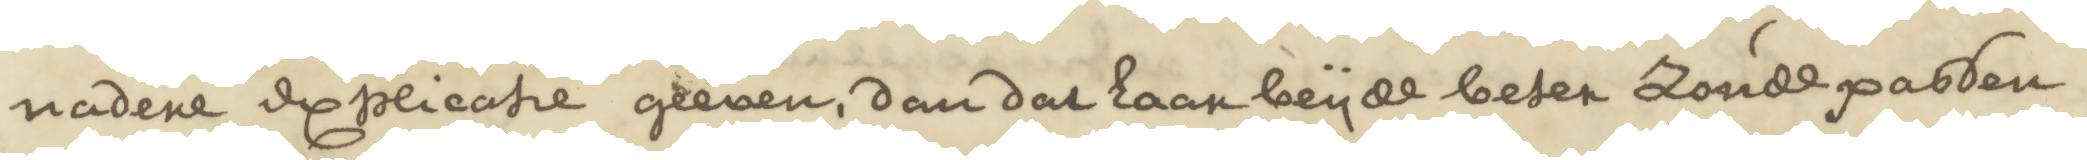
nadere explicatie geeven, dan dat haar beijde beter zoude passen
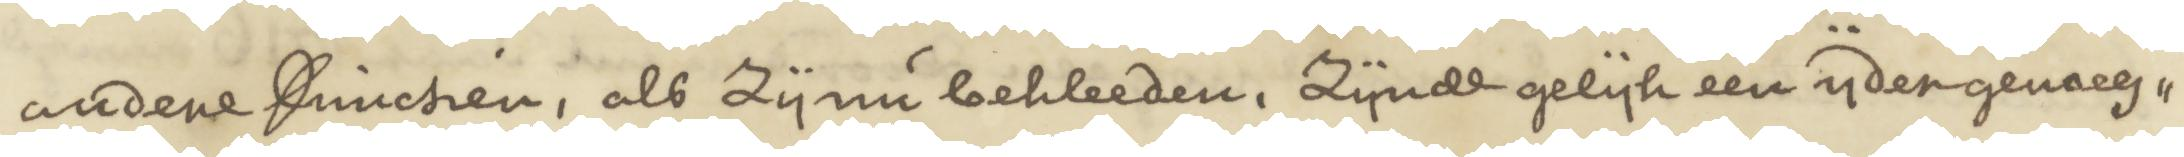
andere functien, als zij nu bekleeden, zijnde gelijk een ijder genoeg„
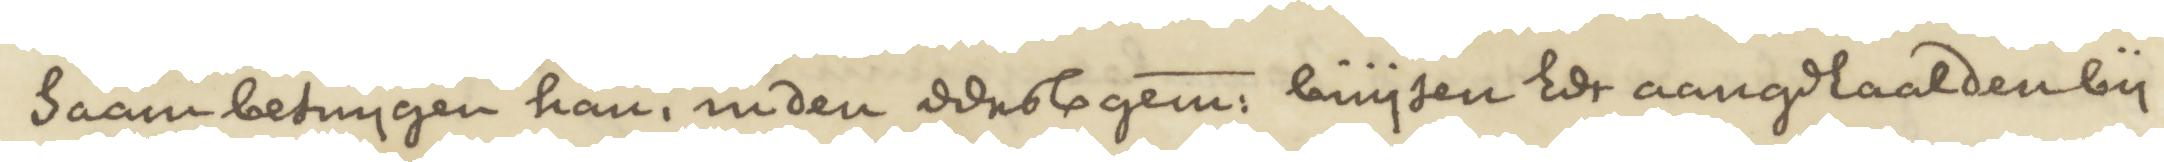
saam betuijgen kan, in den eerst gem: buijten het aangehaalden bij
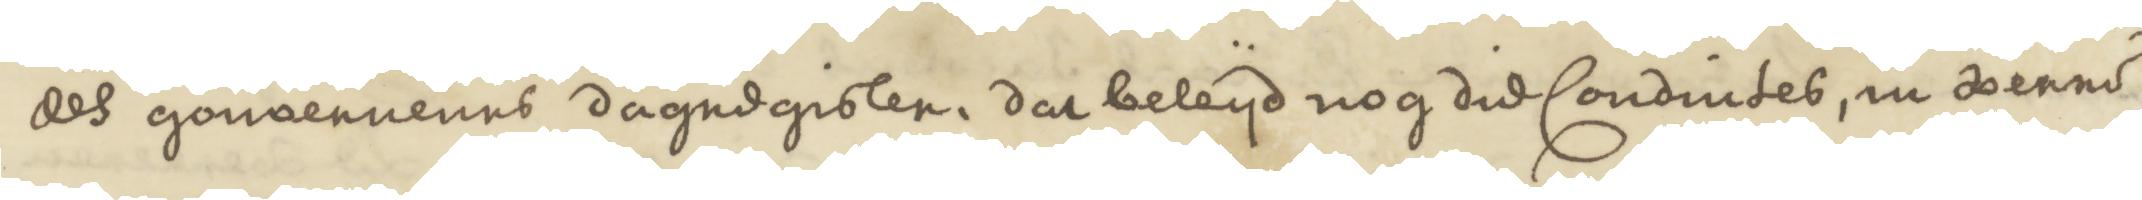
des gouverneurs dagregister, dat beleijd nog die Conduites, in verre
